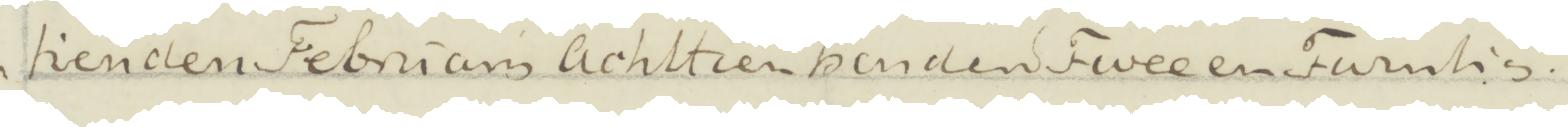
„tienden Februarij achttien honderd Twee en Twintig.
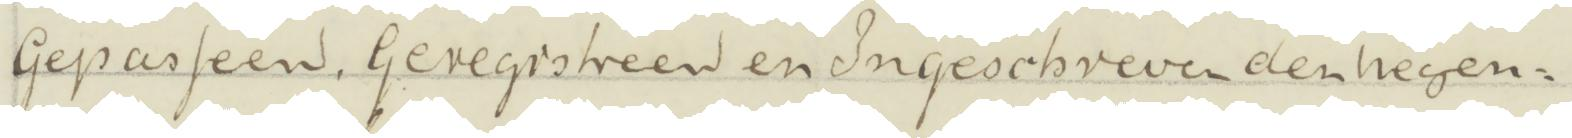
Gepasseerd, geregistreerd en Jngeschreven den negen=
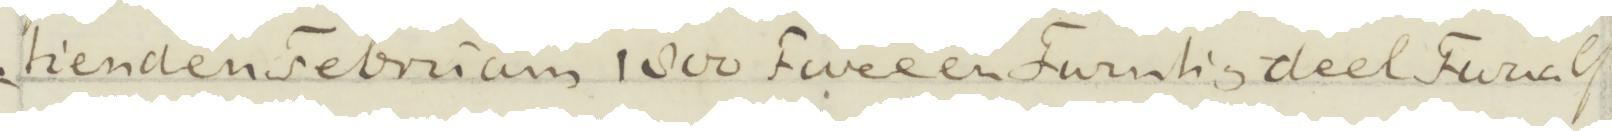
=tienden February 1800 Twee en Twintig deel Twaalf
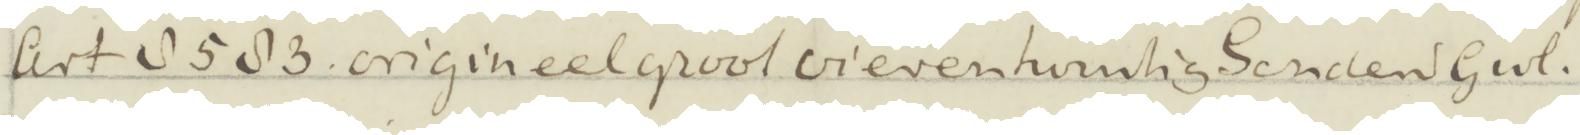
Art 8583. origineel groot vierentwintig honderd Gul.
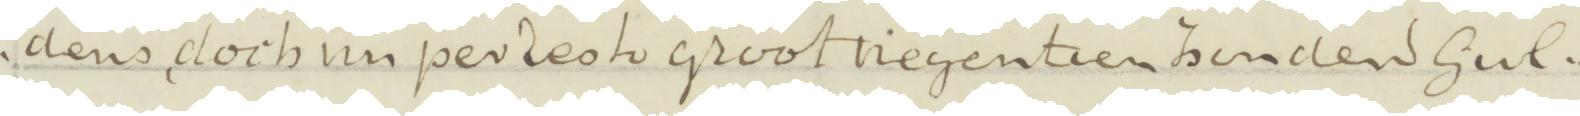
-dens doch nu per resto groot negentien honderd Gul„
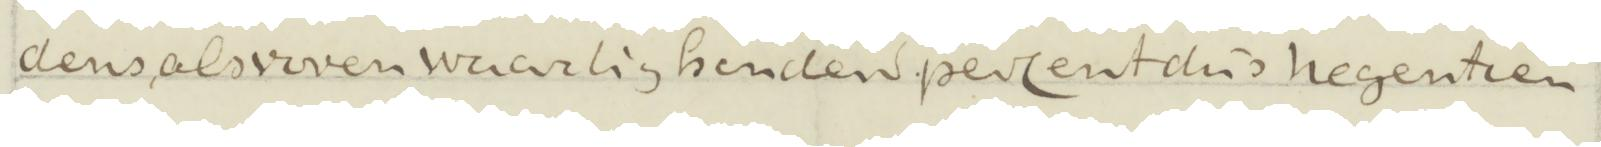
=dens, alsvoren waardig honderd perCent dus negentien
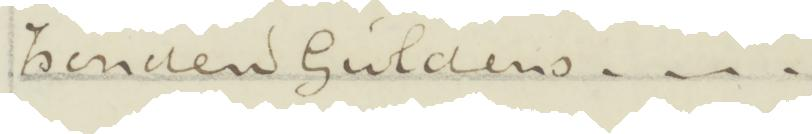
honderd Guldens - - - - - - - - - - - - - - „ 1900 „ —
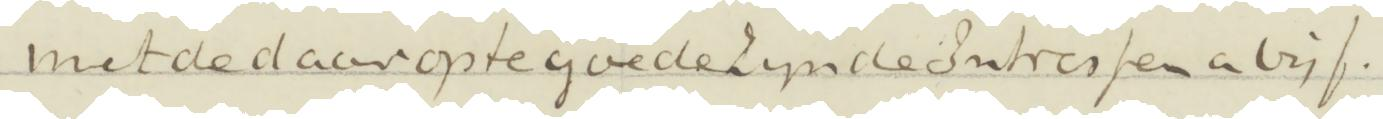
met de daar op te goede zynde Jntressen a vijf.
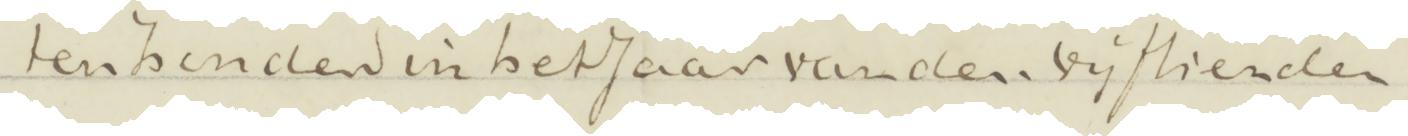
ten honderd in het Jaar van den vijftienden
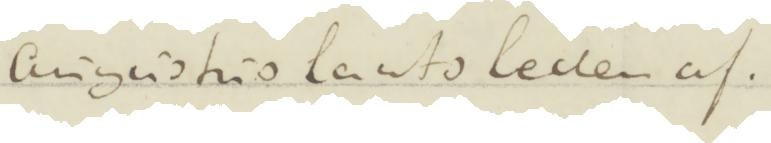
Augustus laatsleden af.
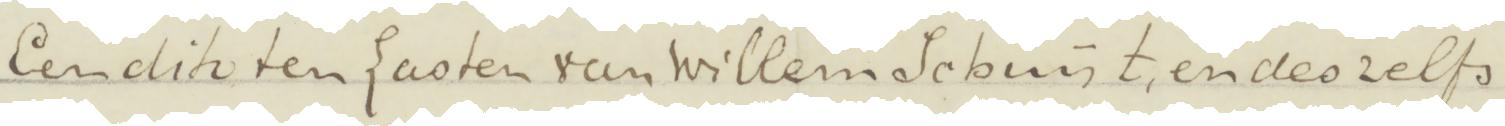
Een dito Lasten van willem Schuijt, en deszelfs
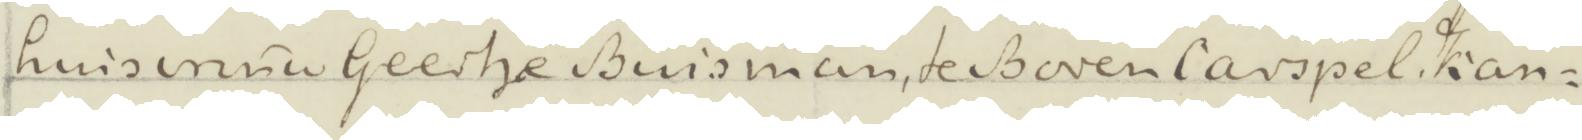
huisvrouw Geertje Buisman, te Boven Carspel, kan=
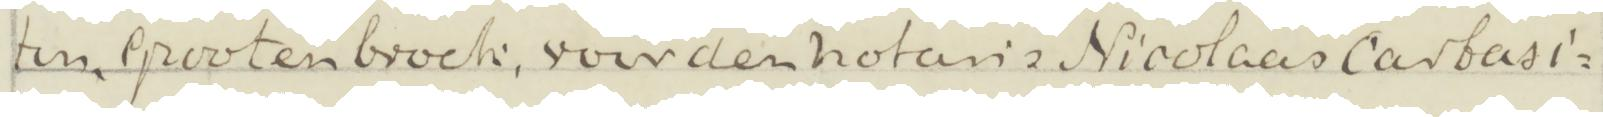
=ton, Grootenbroek, voor den notaris Nicolaas Carbasi=
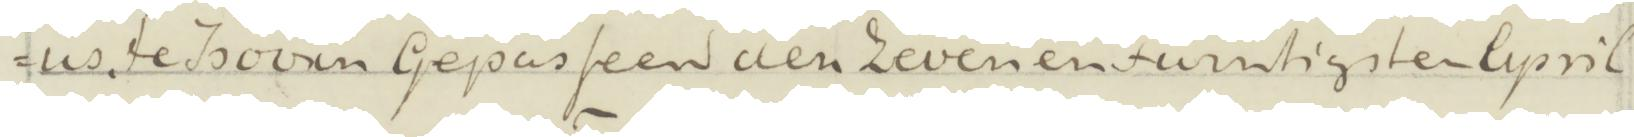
=us te hoorn Gepasseerd den zeven en Twintigsten April
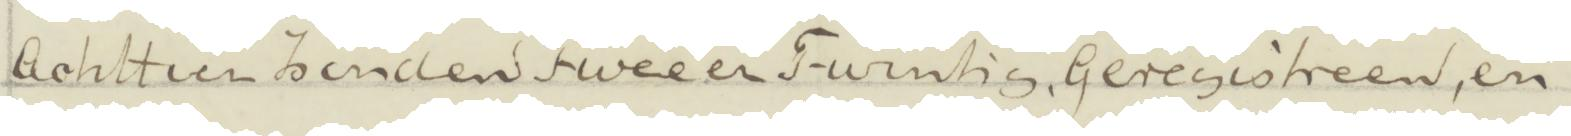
Achttien honderd Twee en Twintig, Geregistreerd, en
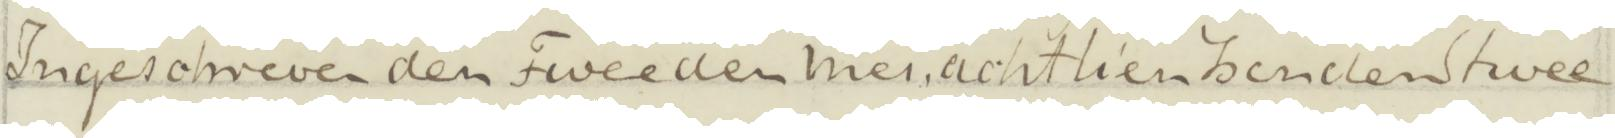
Jngeschreven den Tweeden mei, achttien honded twee
